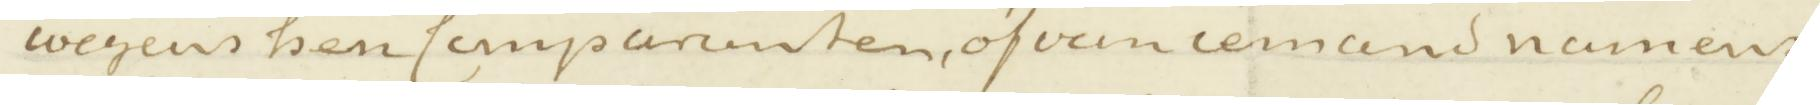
wegens hen Comparanten, of van iemand namens
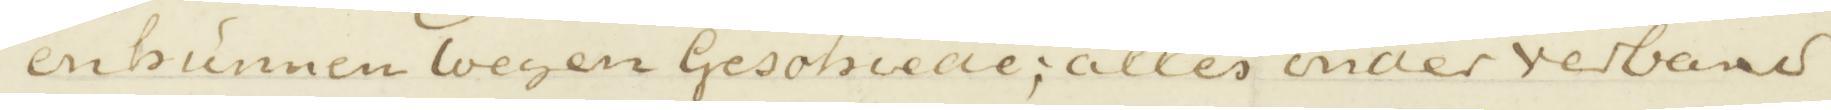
en hunnen wegen Geschiede; alles onder verband
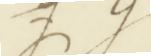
g g
